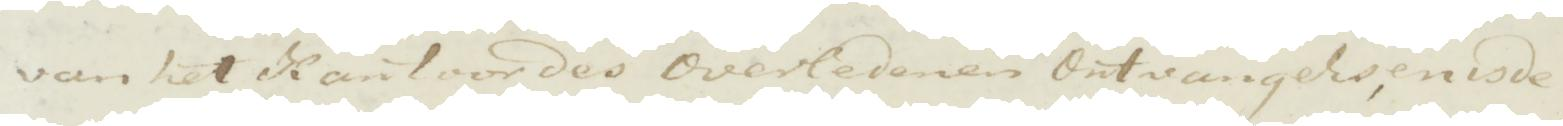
van het Kantoor des overledenen ontvangers, en is de
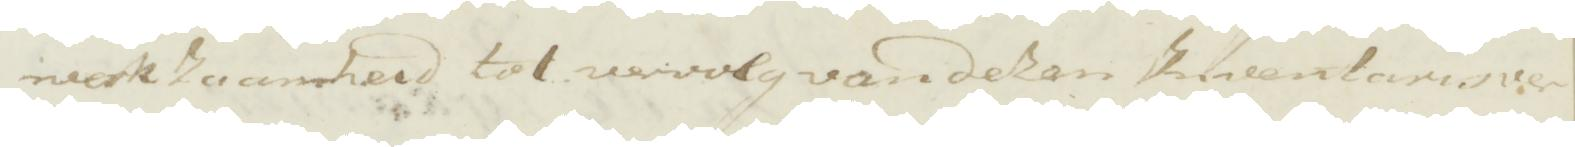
werkzaamheid tot vervolg van dezen Inventaris ver
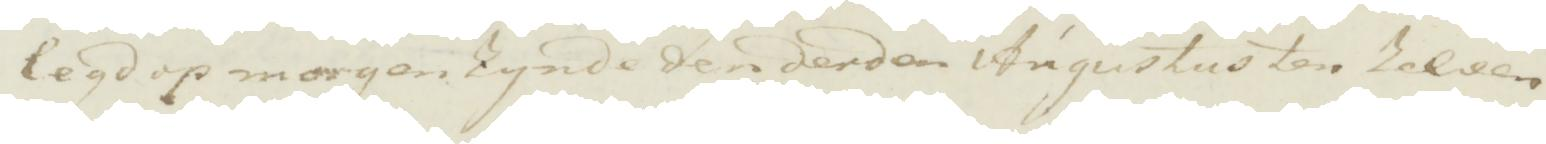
legd op morgen zijnde den derden Augustus ten zelven
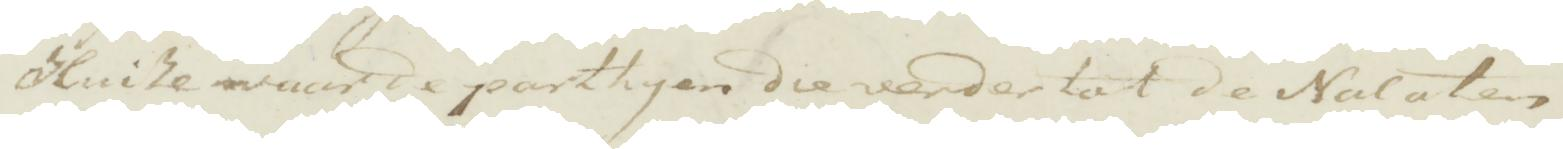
Huize waar de parthyen die verder tot de Nalaten
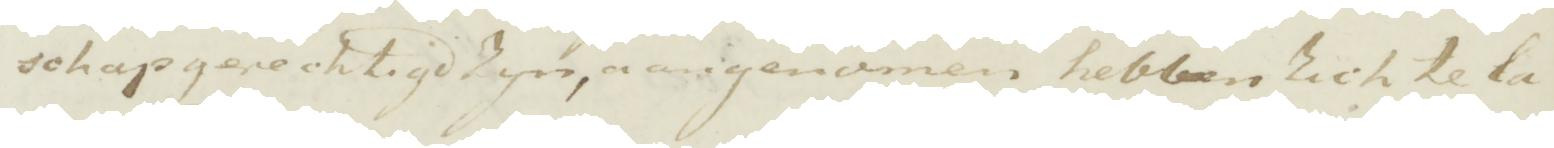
schapgerechtigd zijn, aangenomen hebben zich te la
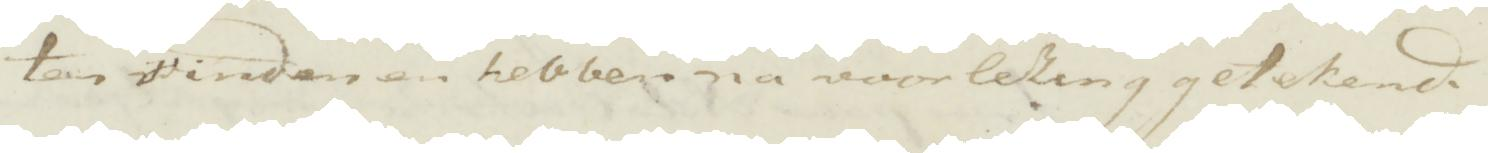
ten vinden en hebben na voor lezing getekend.
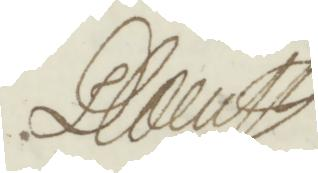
Hoeuft
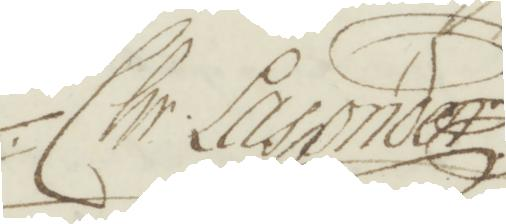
Chr. Lasonder
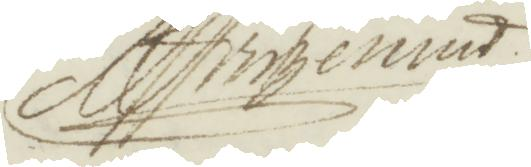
AFbennis
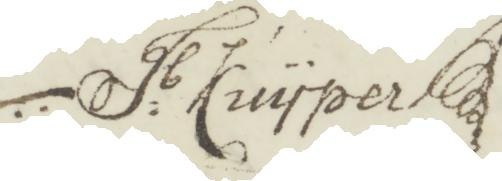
F: Kuijper
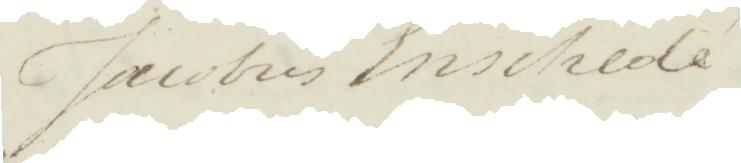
Jacobus Enschede
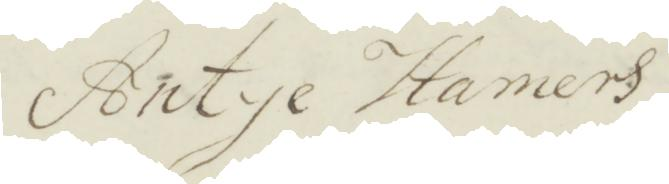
Antje Hamers
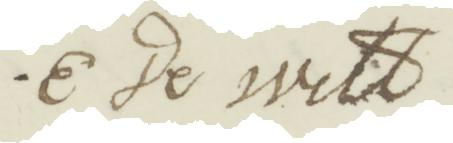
-E De witt
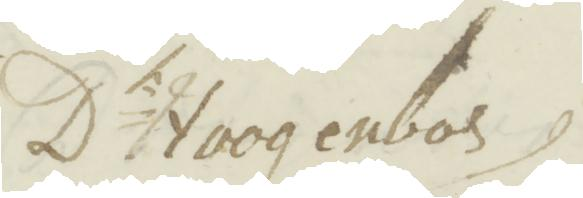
D=k Hoogenbos
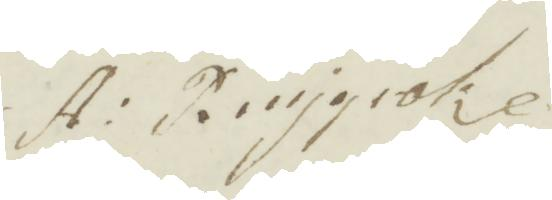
A: Ruijgrok
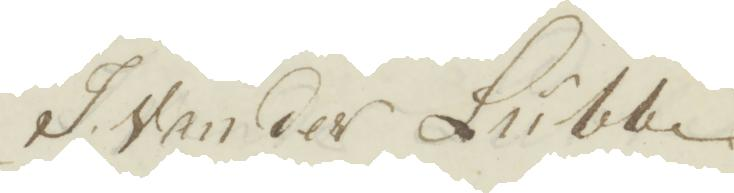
S: van der Lubbe
